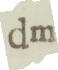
dm
